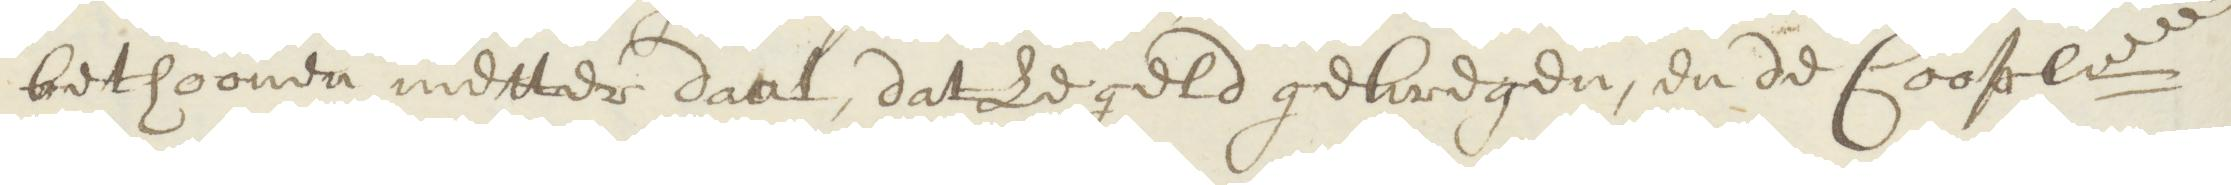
bethoonen metter daat, dat ze geld gekregen, en de Coopl='
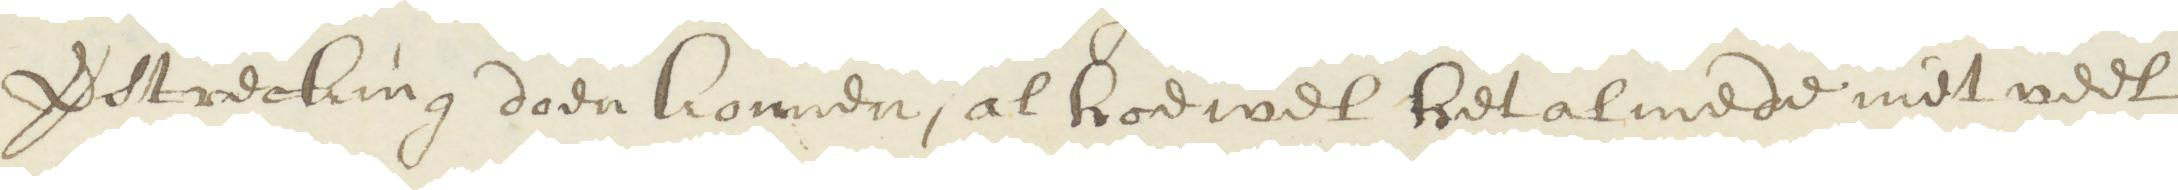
verstrecking doen konnen, al hoe wel het almede niet veel
